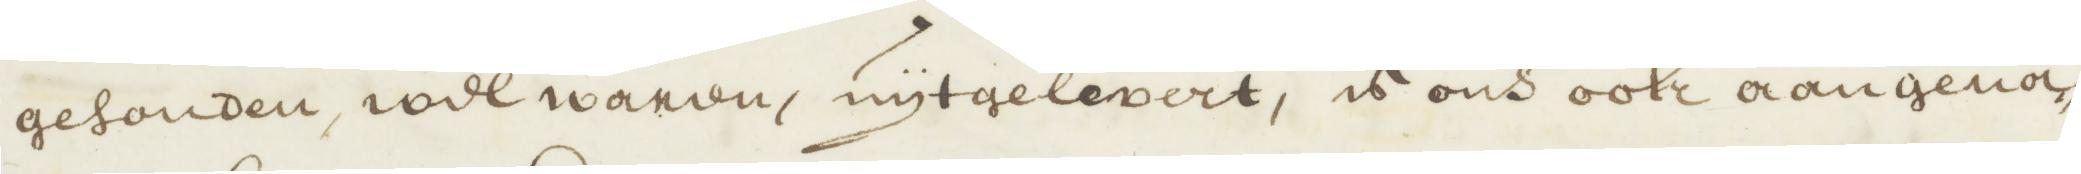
gesonden, wel waren, uijtgelevert, is ons ook aan gena„
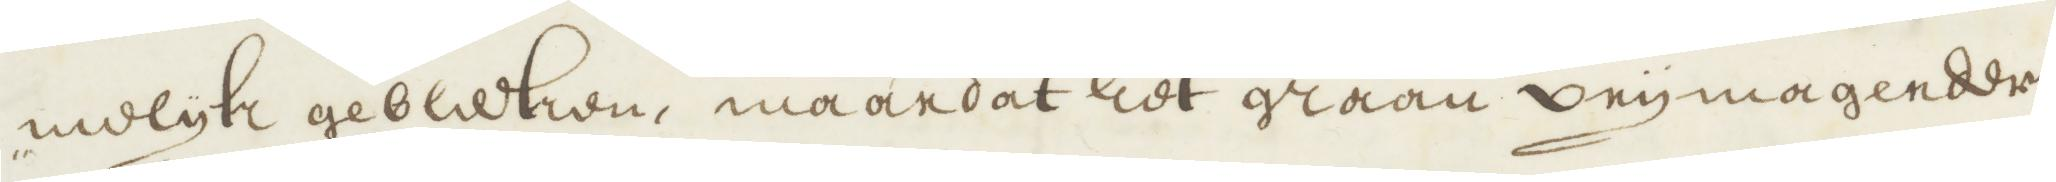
„melijk gebleeken, maar dat het graan vrij magerder
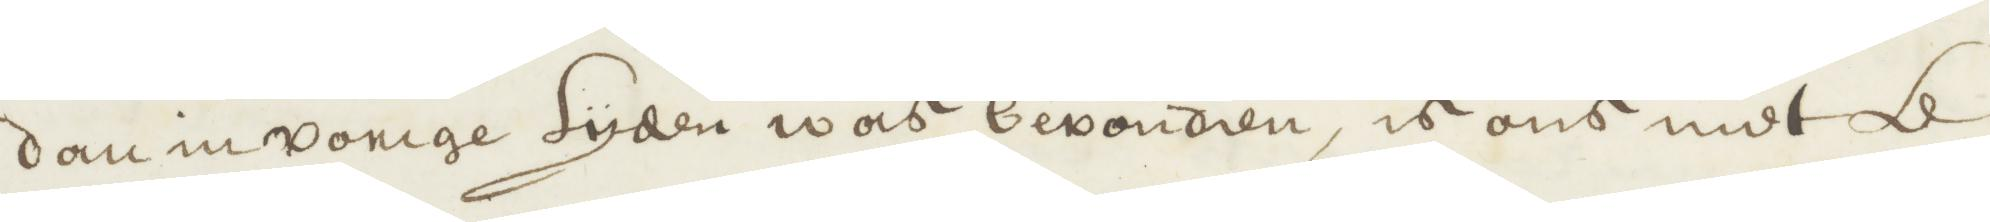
dan in vorige tijden was bevonden, is ons niet te
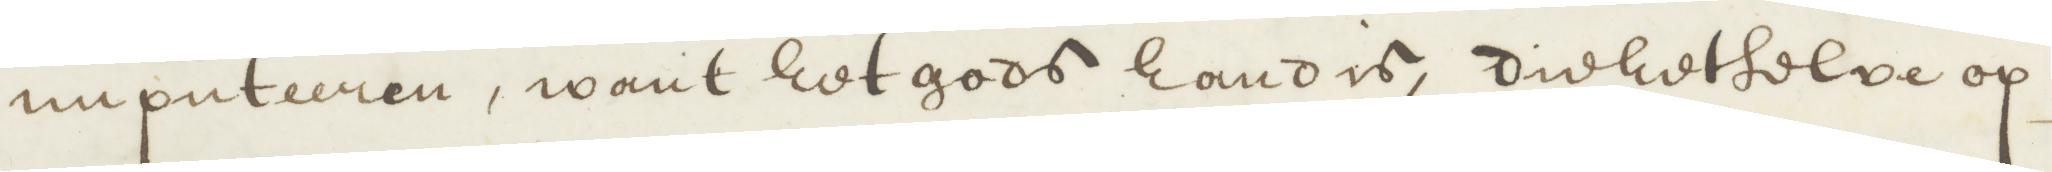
imputeeren, want het gods hand is, die hetselve op
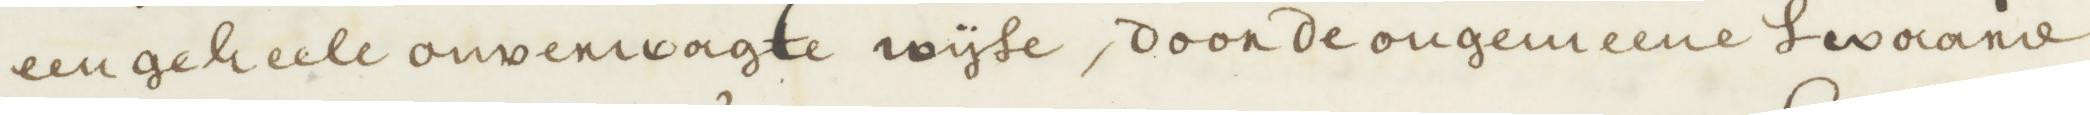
een geheele onverwagte wijse, door de ongemeene swaare
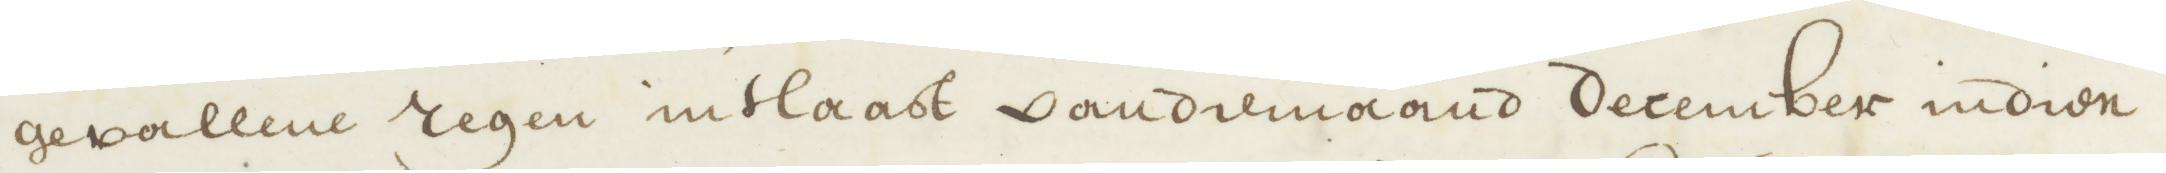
gevallene regen in 'tlaast van demaand december indier
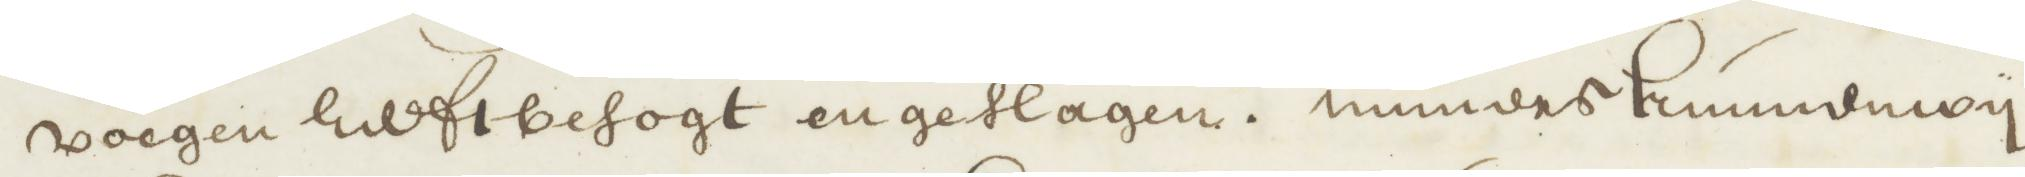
voegen heeft besogt en geslagen. immers kunnen wij
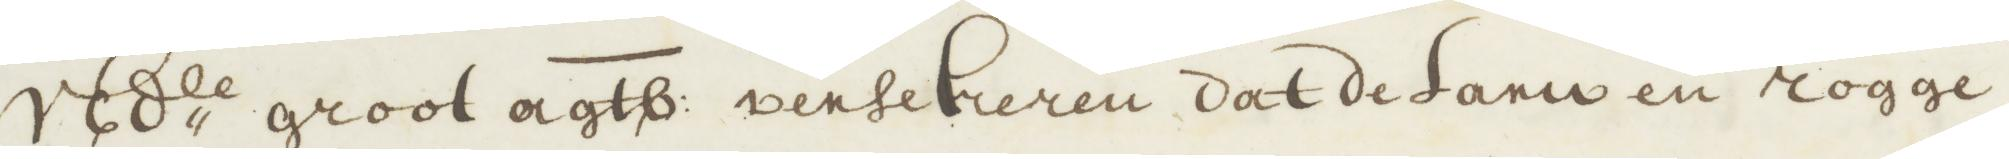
VEd„le groot agtb: versekeren dat de tarw en rogge
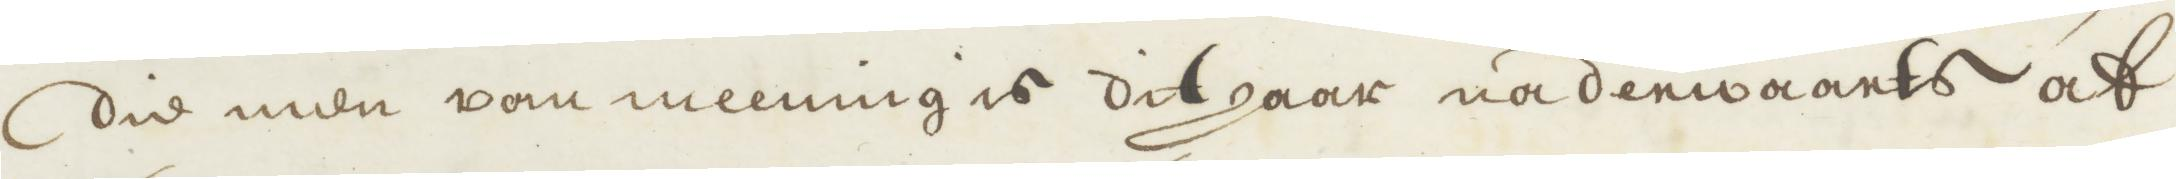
die men van meening is dit jaar na derwaarts af
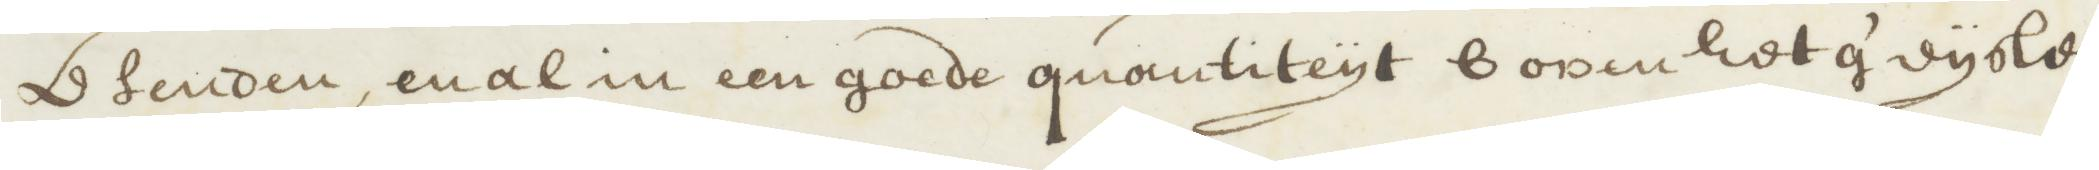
te senden, en al in een goede quantiteijt boven het g’eijste
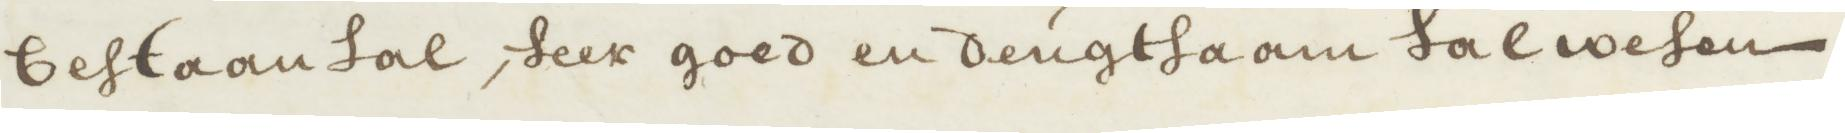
bestaan sal, seer goed en deugtsaam sal wesen.
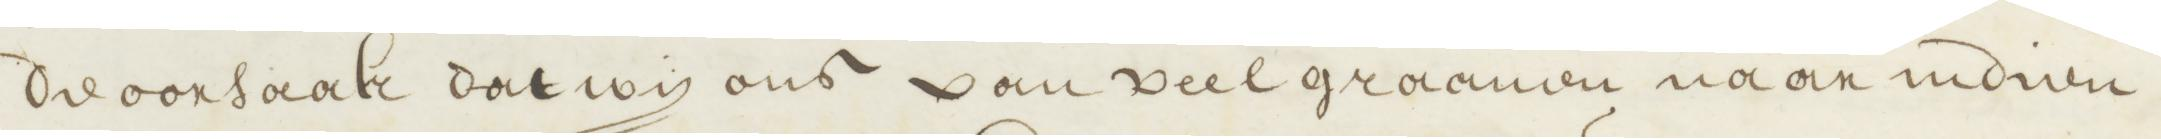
de oorsaak dat wij ons van veel graanen naar indien
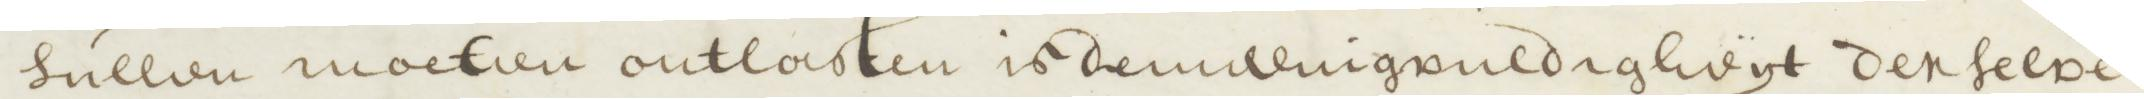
sullen moeten ontlasten is de meenigvuldigheijt derselve
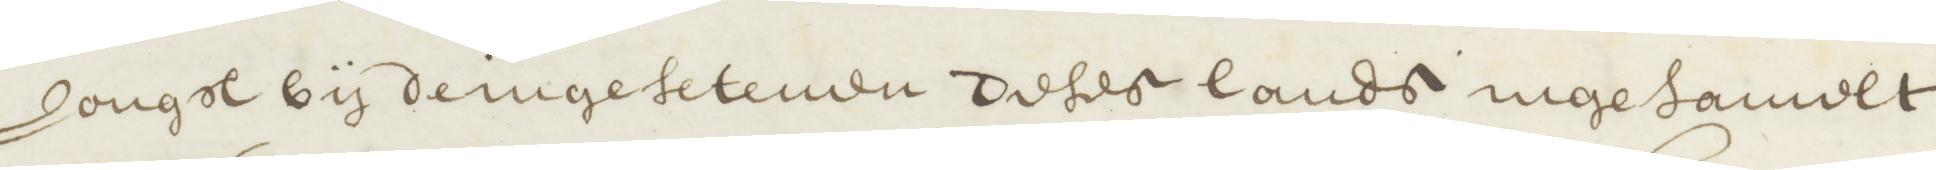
jongst bij de ingesetenen deses lands ingesamelt
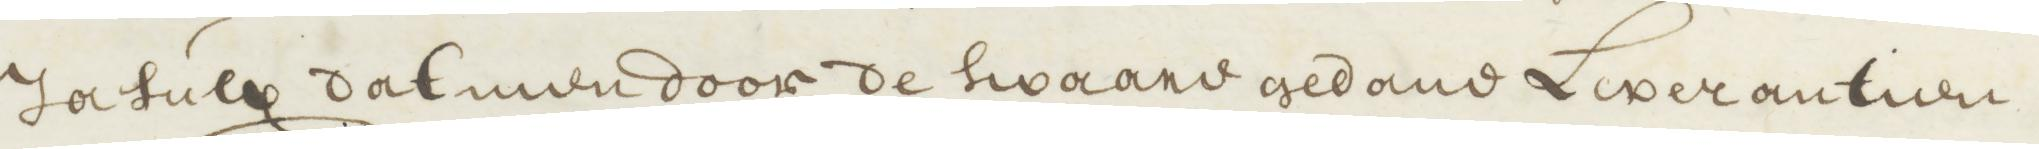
Ja sulx dat men door de swaare gedane Leverantien
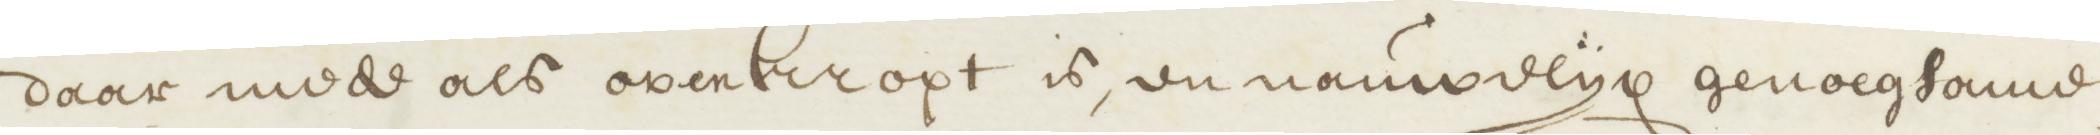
daar mede als overkropt is, en nauwelijx genoegsame
